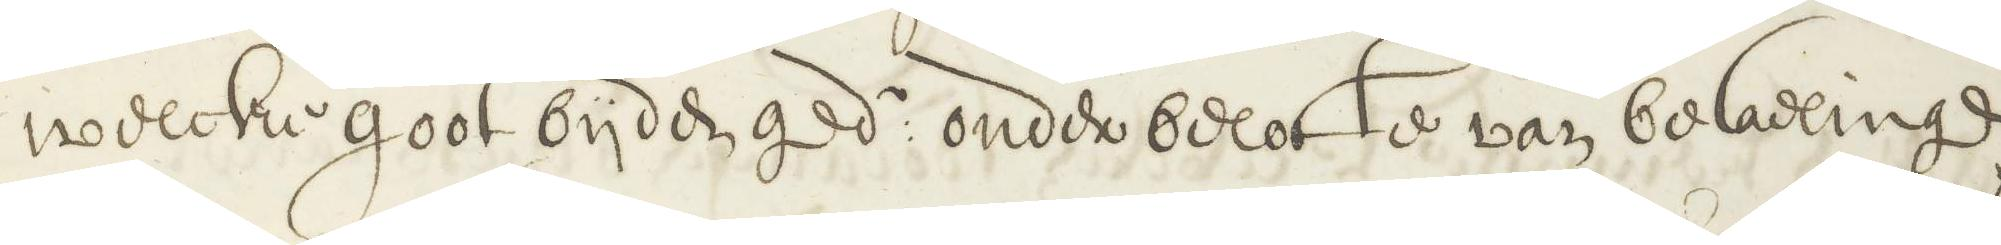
welcke goot bij den ged:' onder belofte van betaelinge
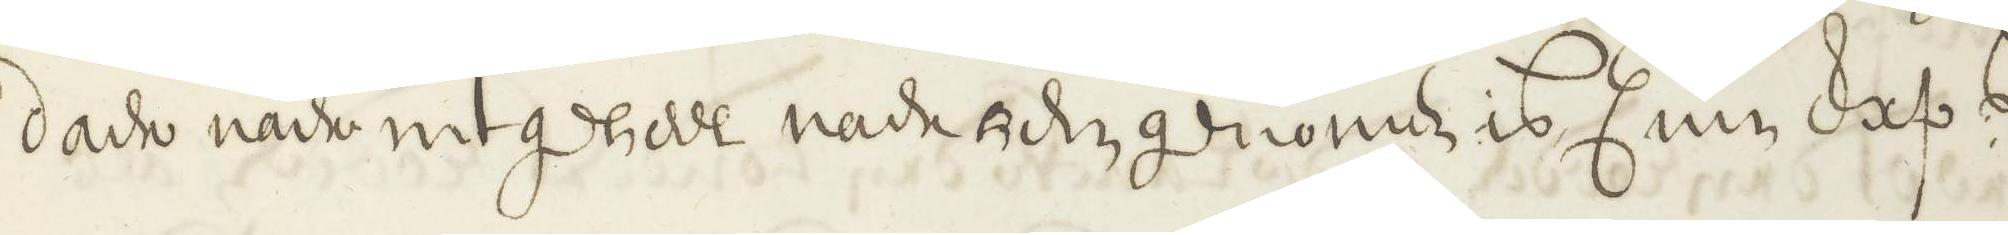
daer naer int geheel naer hem genomen is, Cum Exp:s
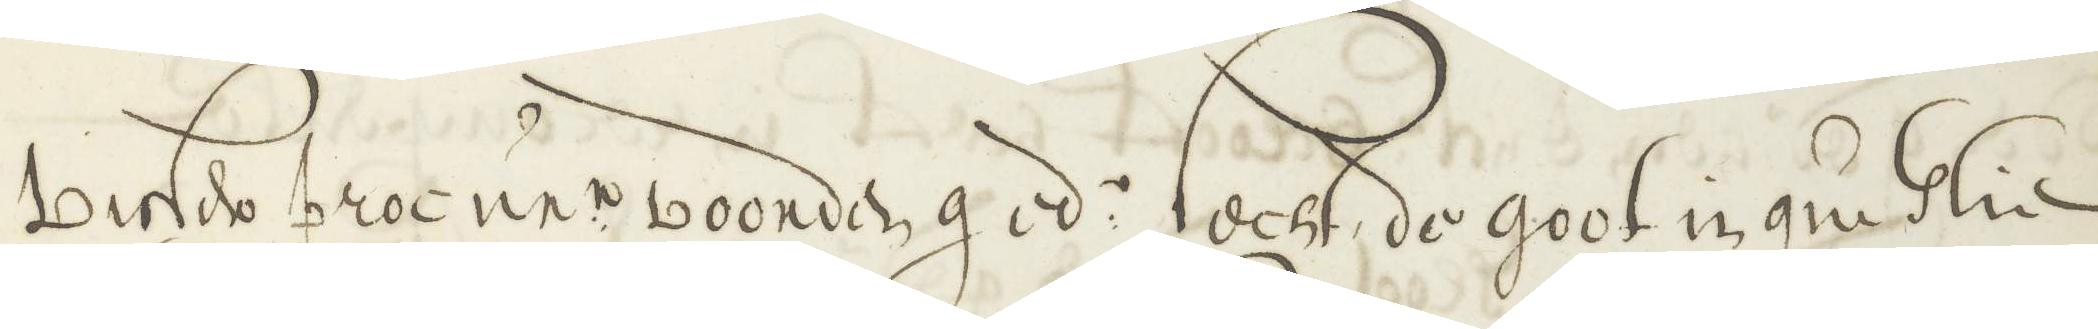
Visser procur:r voorden ged:' secht, de goot in questie
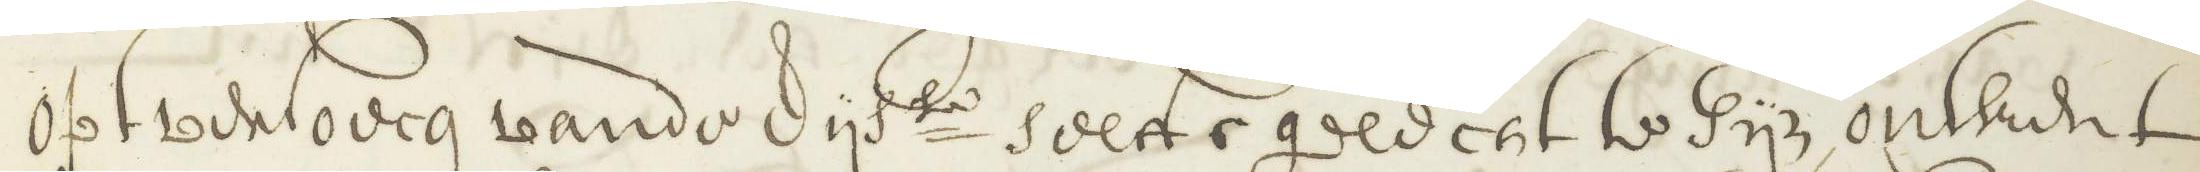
op t versoecq vande Eijs=se selffs gelecht te sijn, ontkent
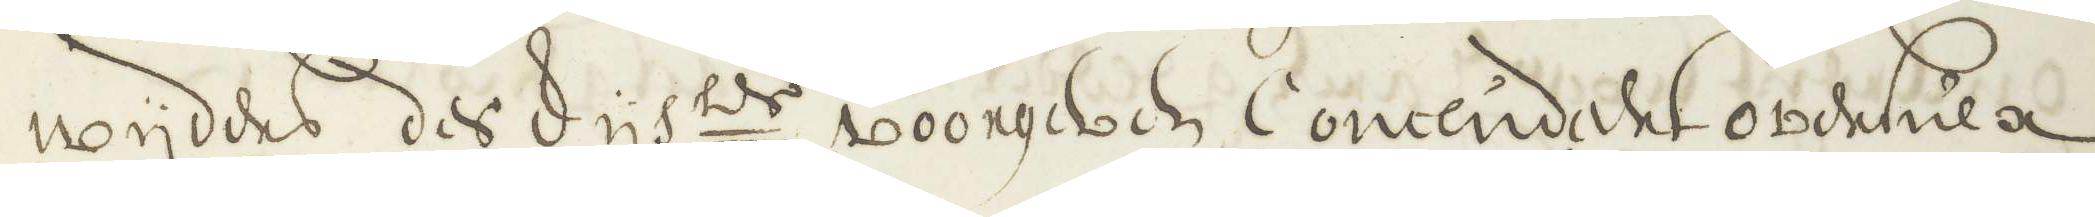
wijders des Eijs=ses voorgeven, Concludeert oversulx
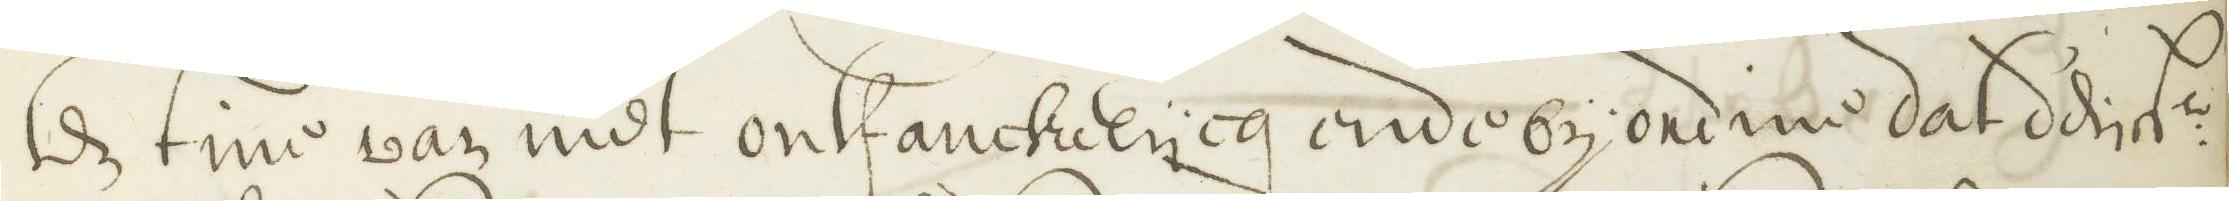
ten fine van niet ontfanckelijcq ende bij ordine dat d; eijss:se
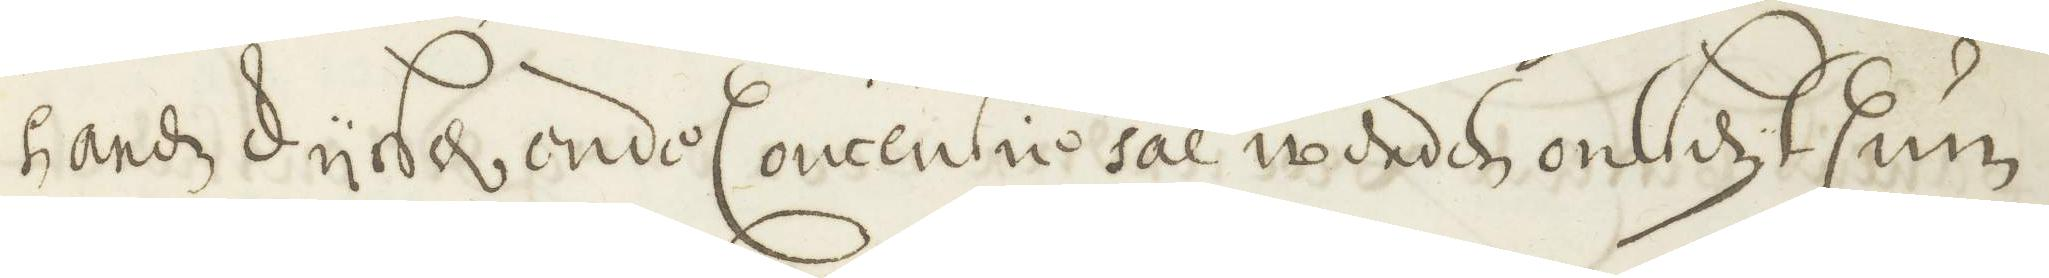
haren Eijsch ende Conclusie sal werden ontseijt Cum
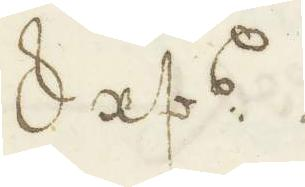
Exp:s
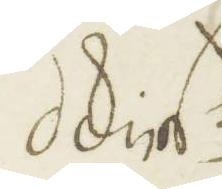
d Eijss=se
